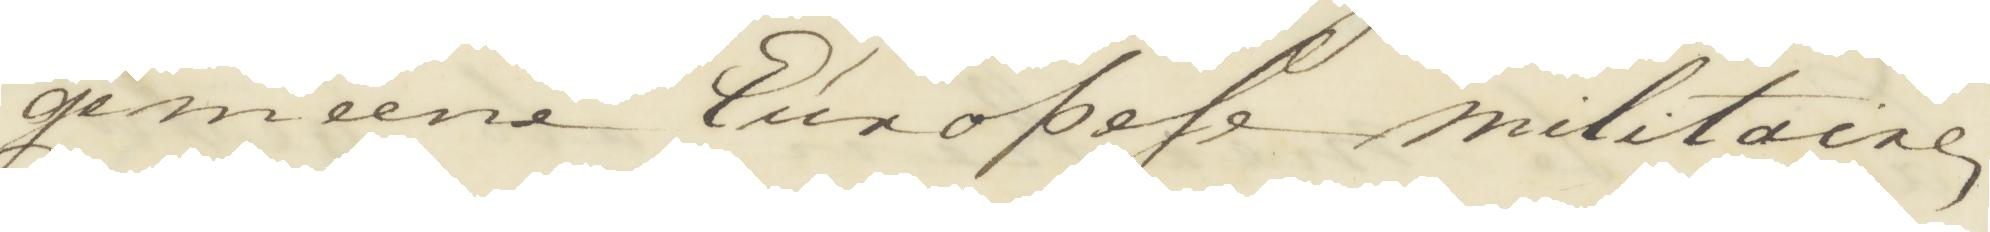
gemeene Europese militairen
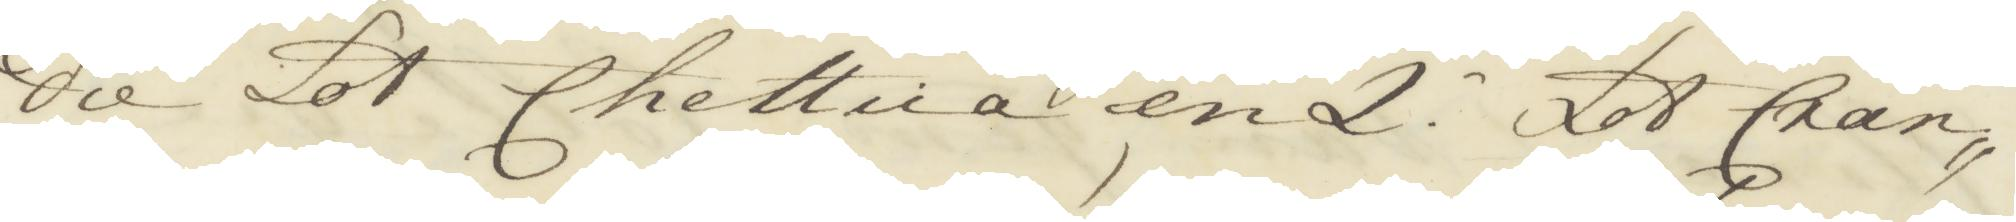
die tot Chettua en 2. tot Cran„
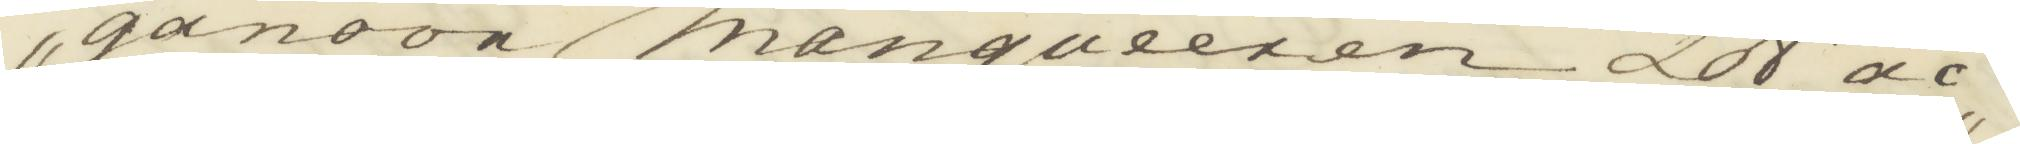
„ganoor manqueeren tot ac„
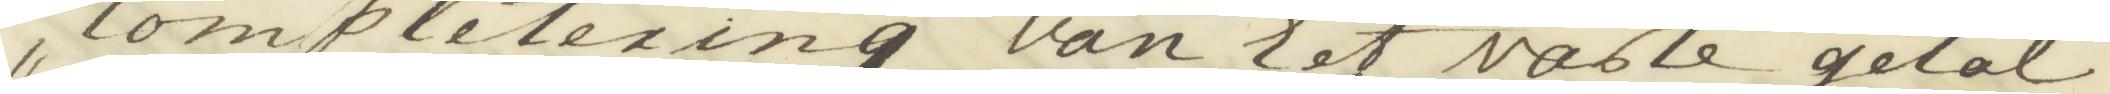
„completering van het vaste getal
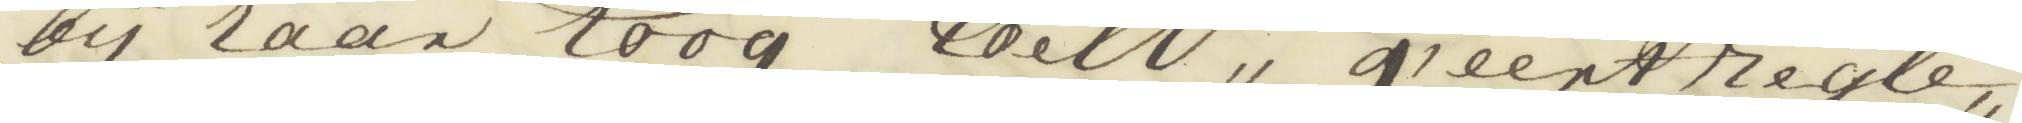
bij haar hoog Edelh„s g'eert regle„
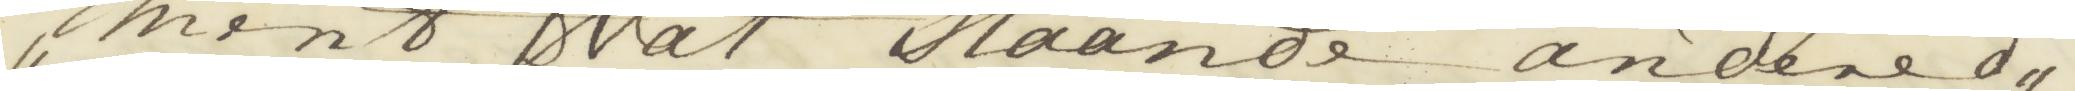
„ment vervat staande andere d„o
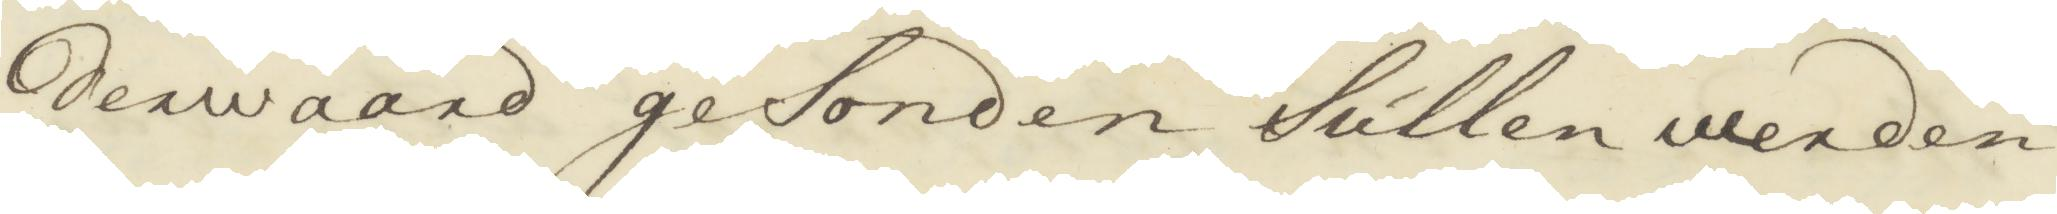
derwaard gesonden sullen werden
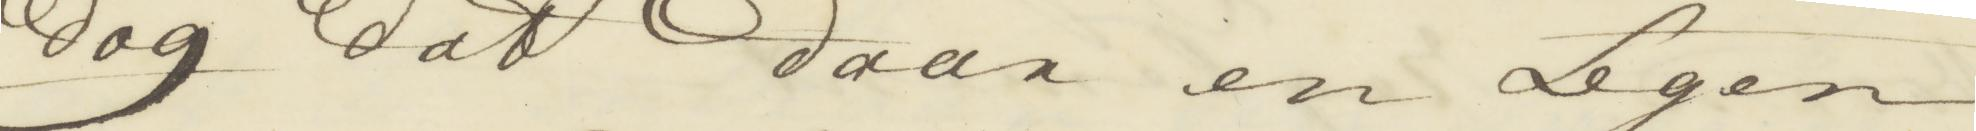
dog dat daar en tegen
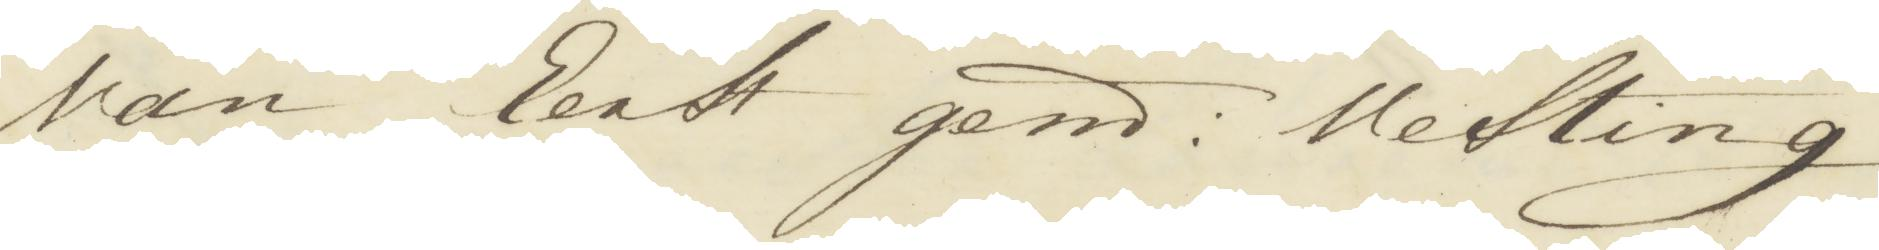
van Eerst gem: vesting
